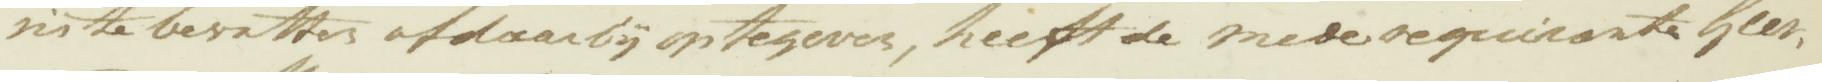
ris te bevatten of daarbij op te geven, heeft de mede requirant Geer„
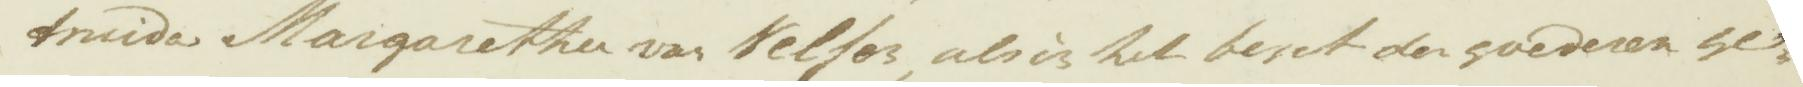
truida Margaretha van Velsen, als is het bezit der goederen ge„
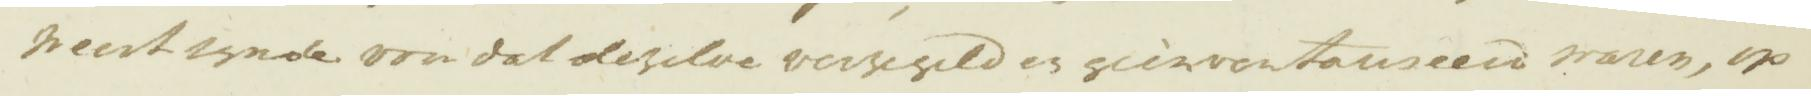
weest zynde voor dat dezelve verzegeld en geinventariseerd waren, op
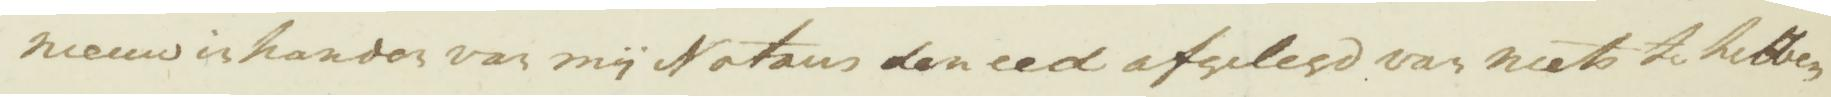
nieuw in handen van mij Notaris den eed afgelegd van niets te hebben
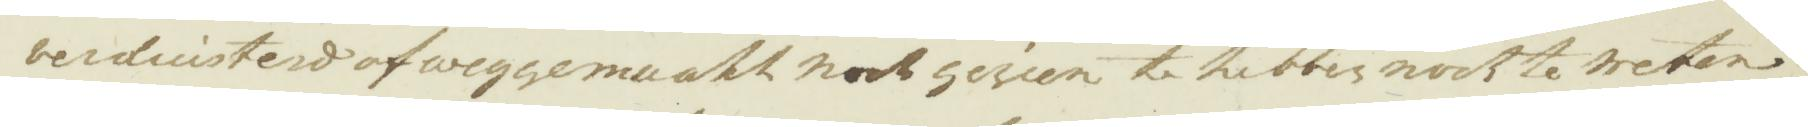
verduisterd of weggemaakt noch gezien te hebben noch te weten
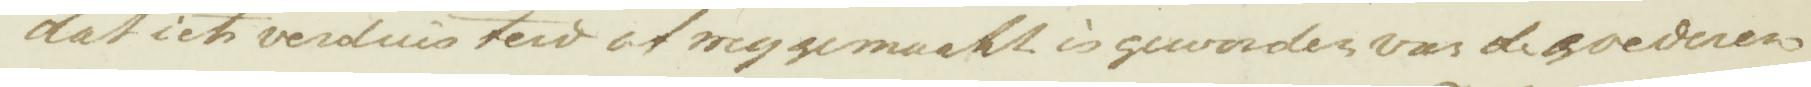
dat iets verduisterd of weggemaakt is geworden van de goederen
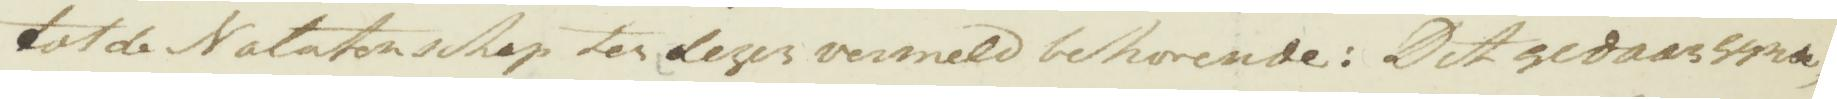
tot de Nalatenschap ten dezen vermeld behorende: Dit gedaan zynde,
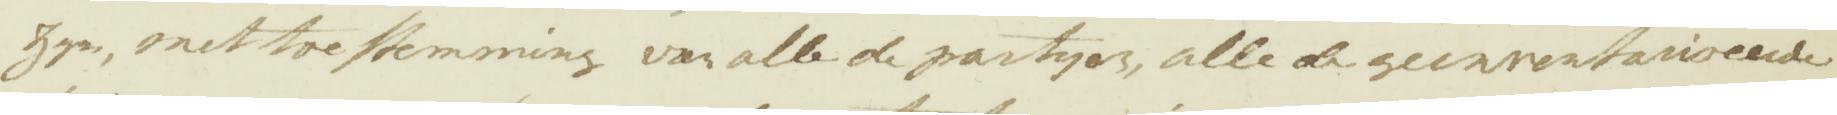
zyn, met toestemming van alle de partijen, alle de geinventariseerde
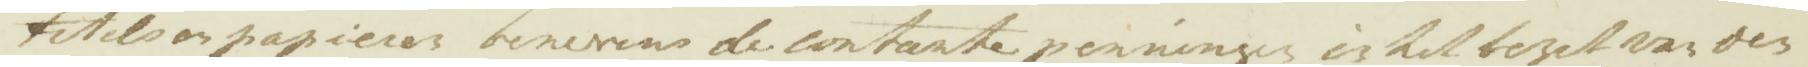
titels en papieren benevens de contante penningen is het bezit van den
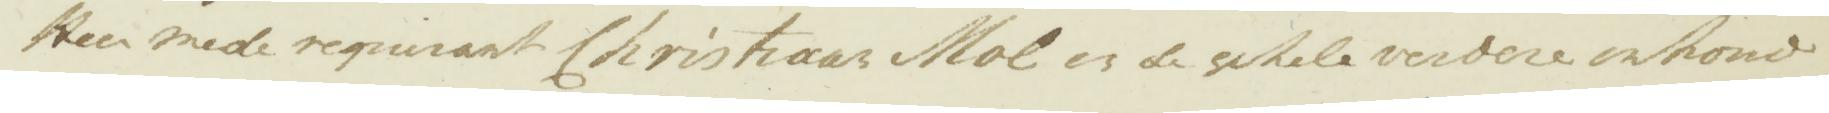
Heer mede requirant Christiaan Mol in de gehele verdere inhoud
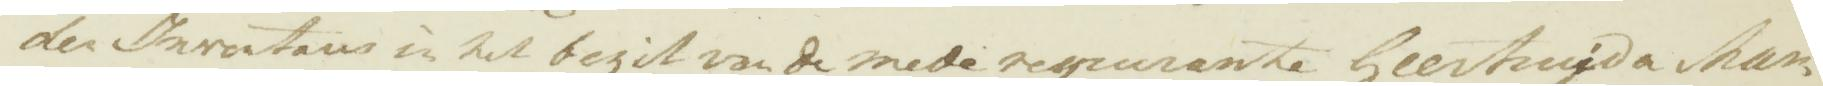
der Inventaris in het bezit van de mede requirante Geertruyda Mar
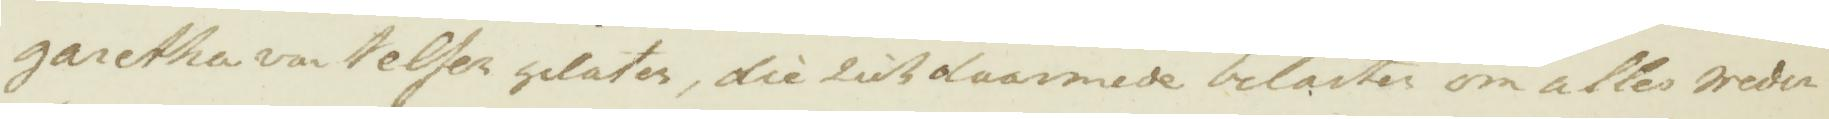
garetha van Velsen gelaten, die zich daarmede belasten om alles weder
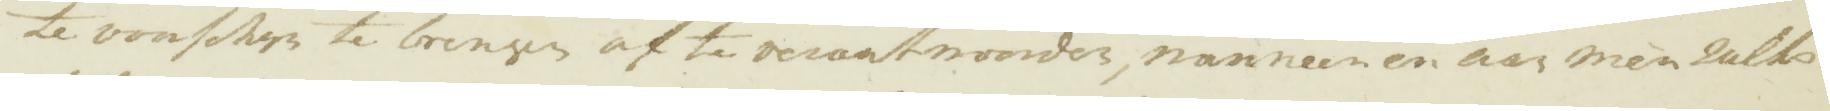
te voorschyn te brengen of te verantwoorden, wanneer en aan wien zulks
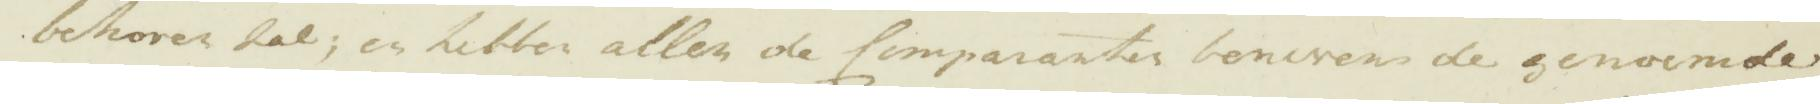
behoren zal; en hebben allen de Comparanten benevens de genoemde
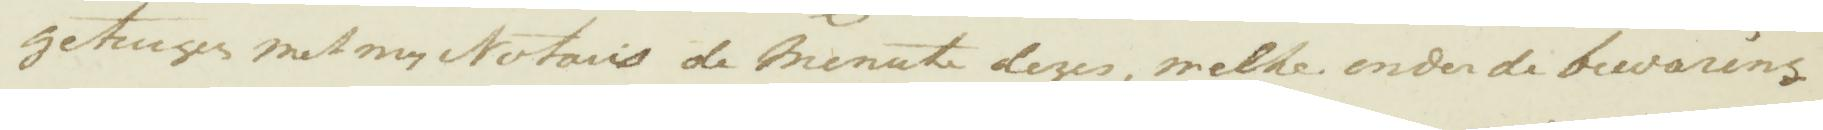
getuigen met my Notaris de minute dezes, welke onder de bewaring
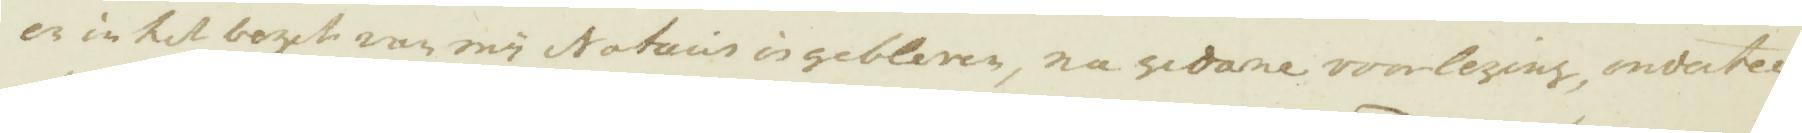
en in het bezit van mij Notaris is gebleven, na gedane voorlezing, ondertee
